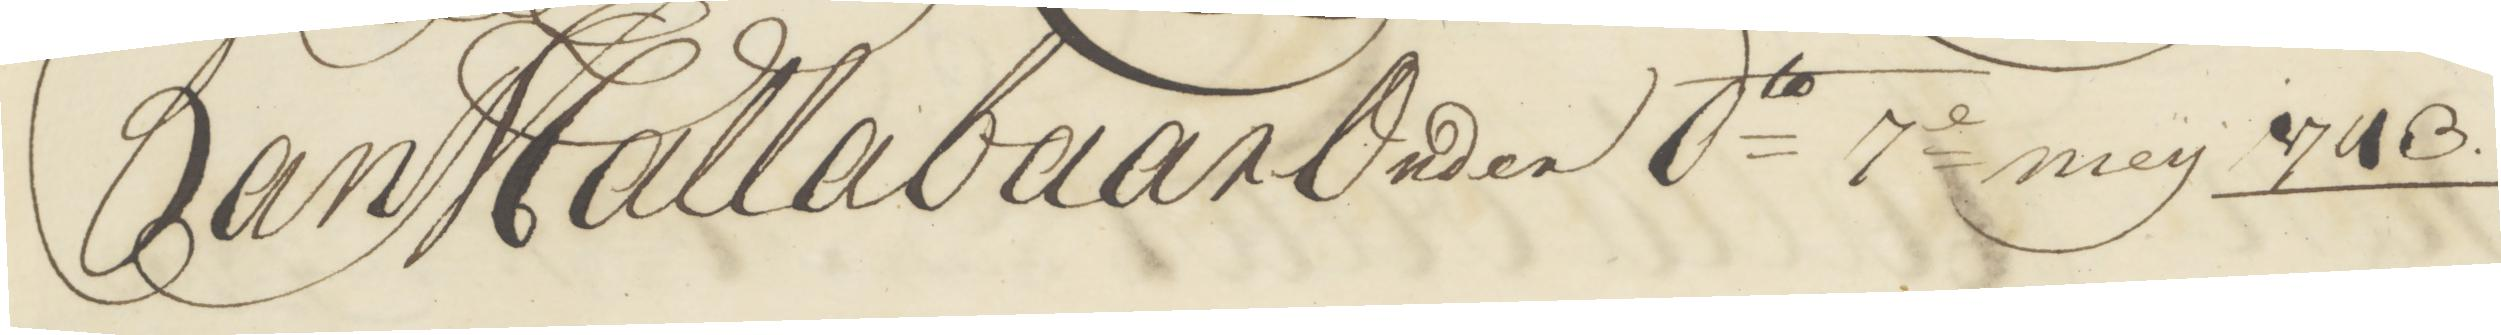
Van Mallabaar Onder d=to 7=e meij 1743.
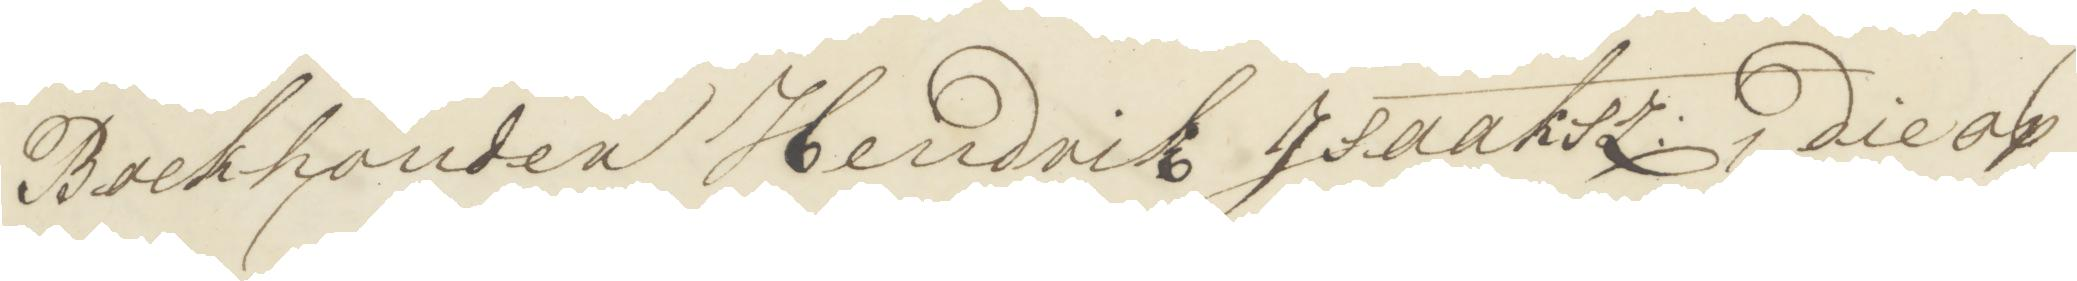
Boekhouder Hendrik Isaaksz:, die op
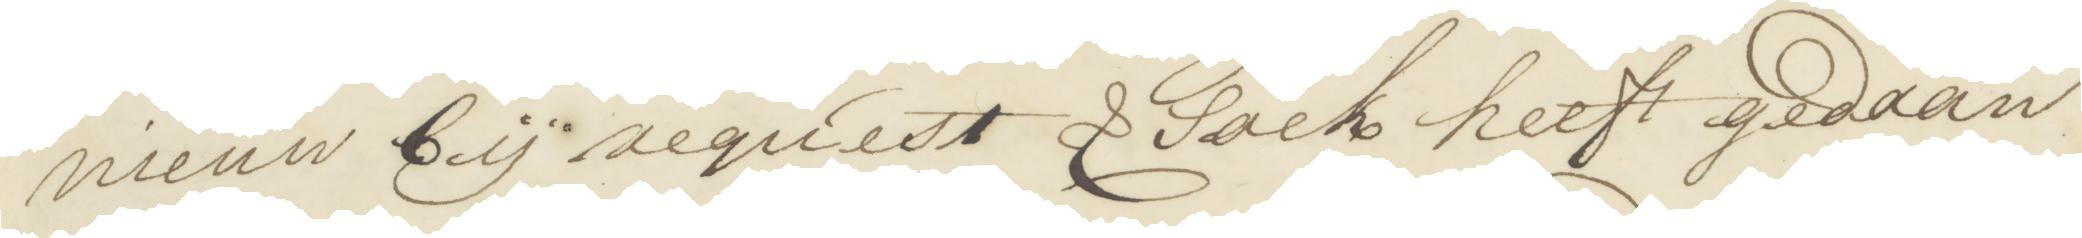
nieuw bij request versoek heeft gedaan
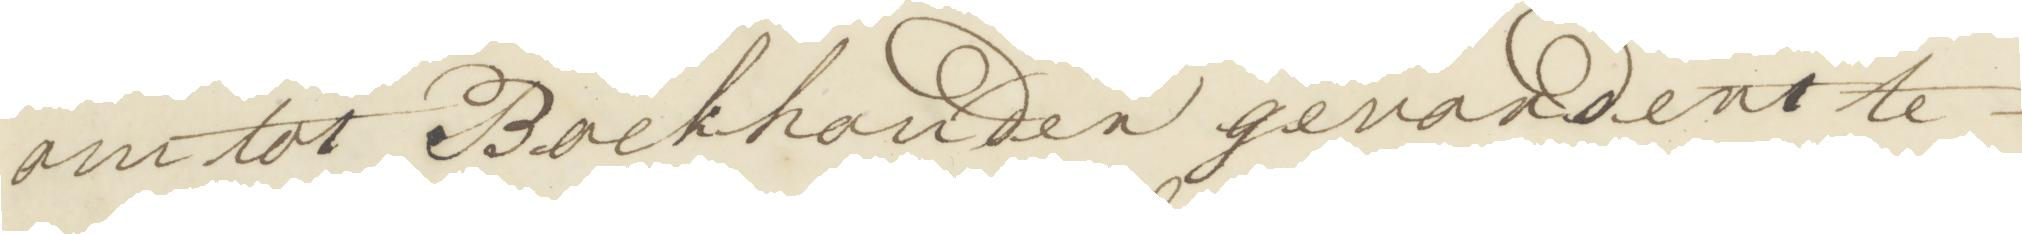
om tot Boekhouder gevordert te
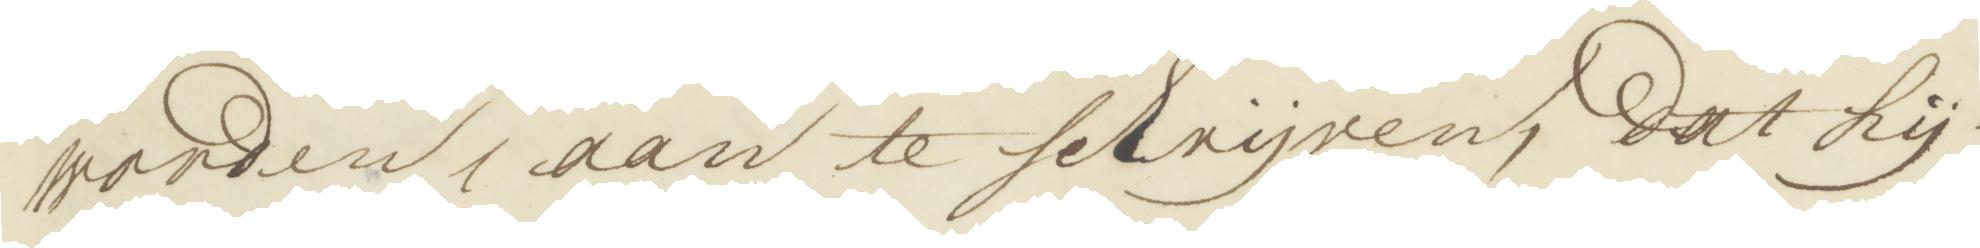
worden, aan te schrijven, dat hij
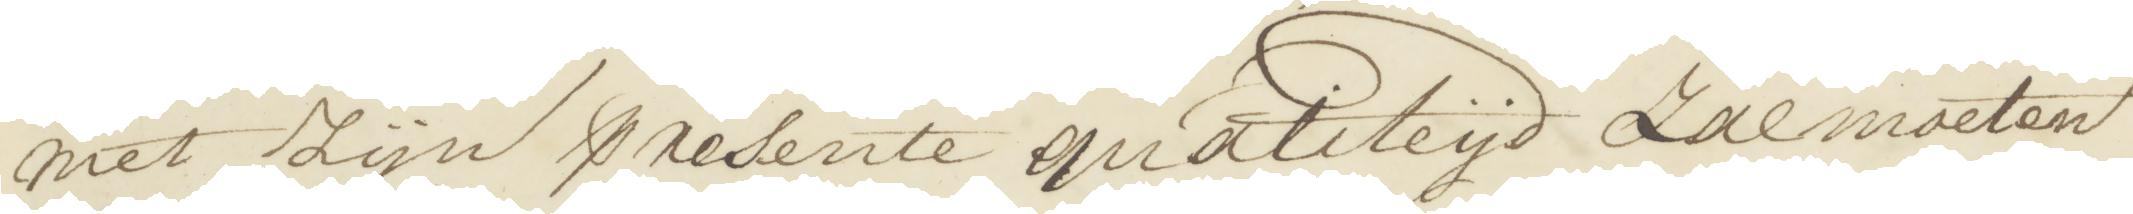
met zijn presente qualiteijd zal moeten
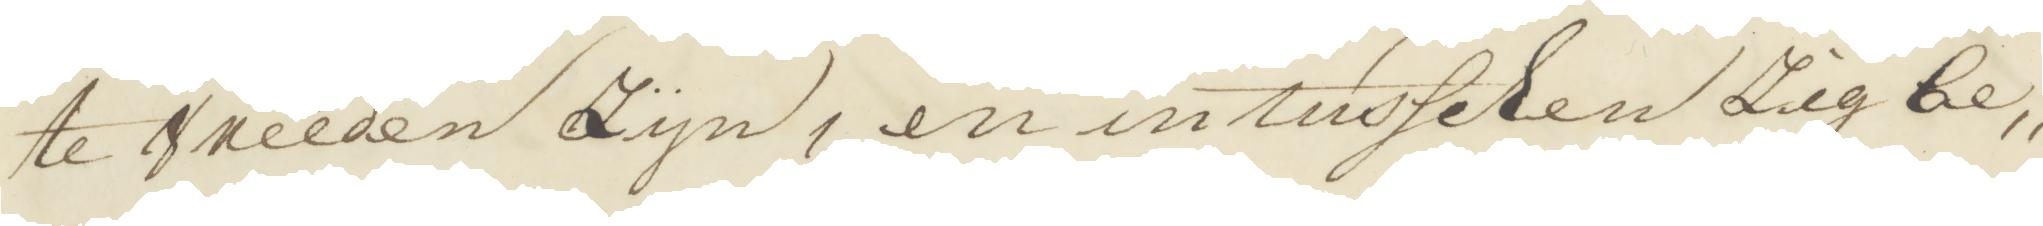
te vreeden zijn, en intusschen zig be„
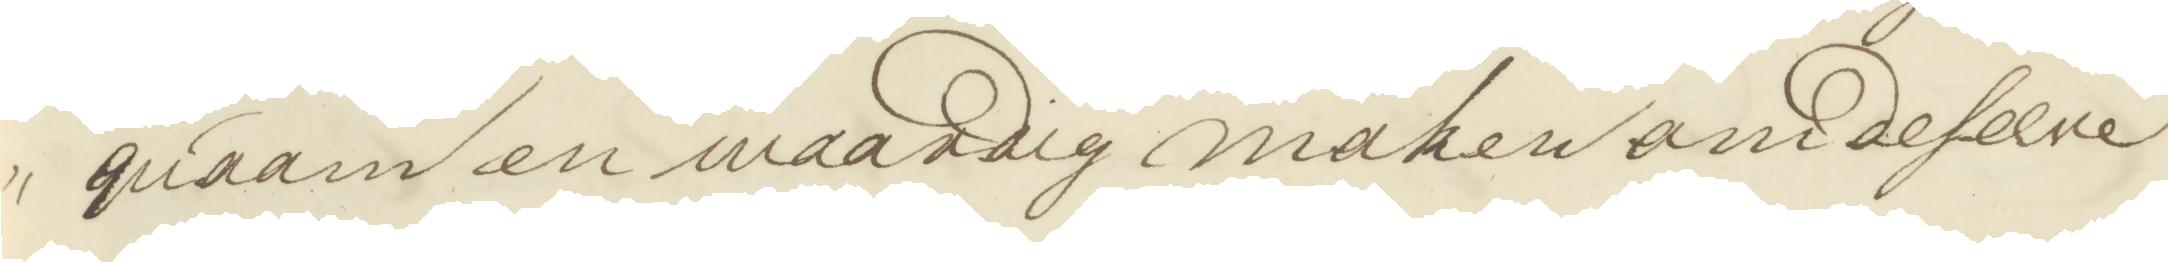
„quaam en waardig maken om deselve
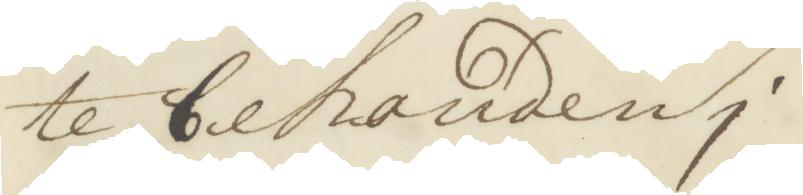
te behouden;
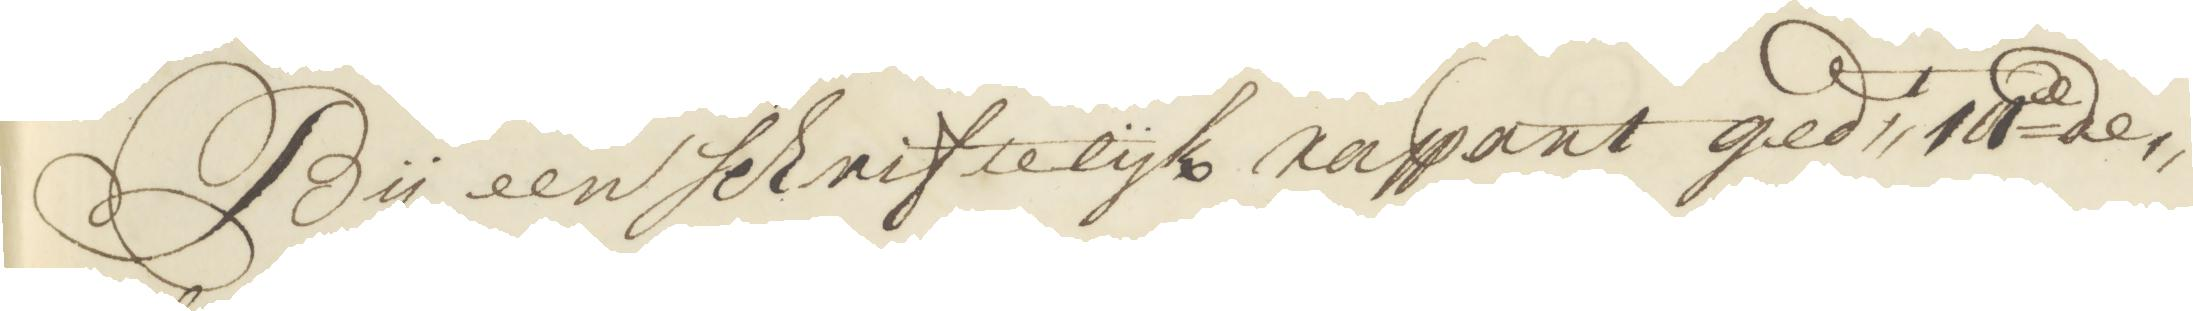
Bij een schriftelijk rapport ged„t 14=e de„
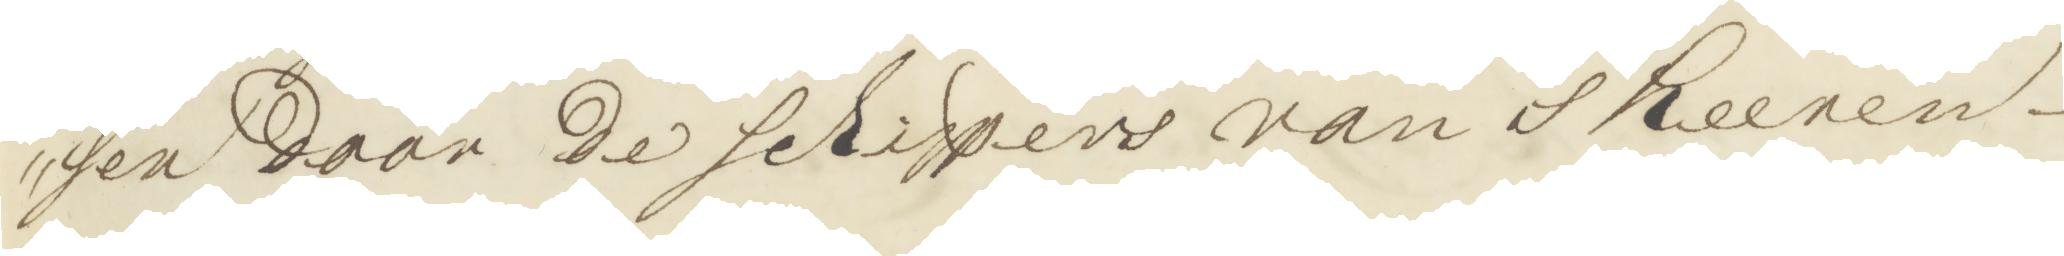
„ser door de schippers van 's heeren -
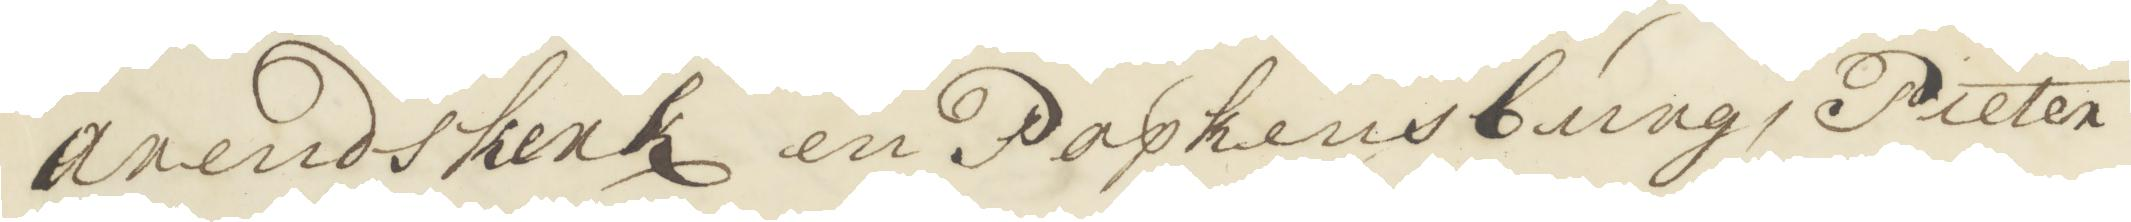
arendskerk en Popkensburg, Pieter
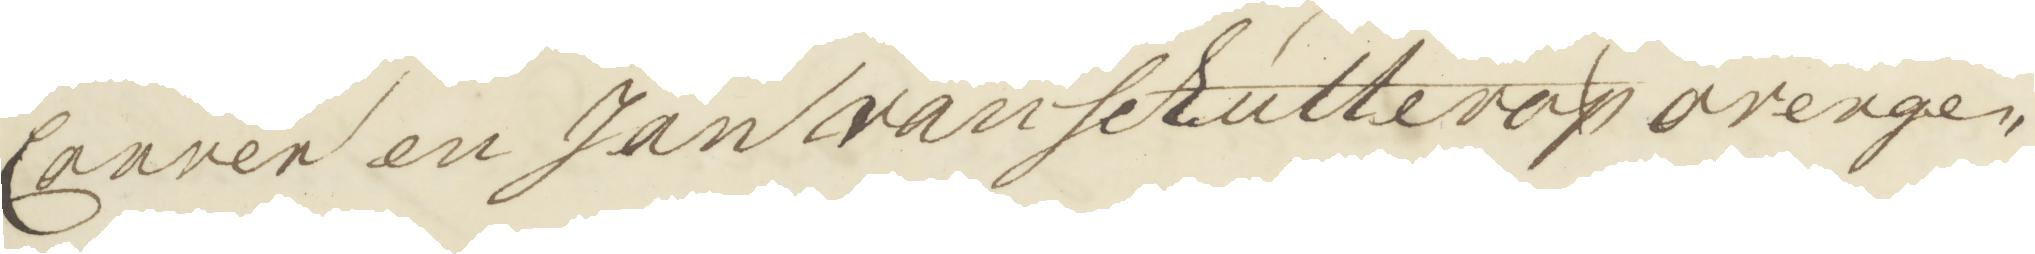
Corver en Jan van schutterop overge„
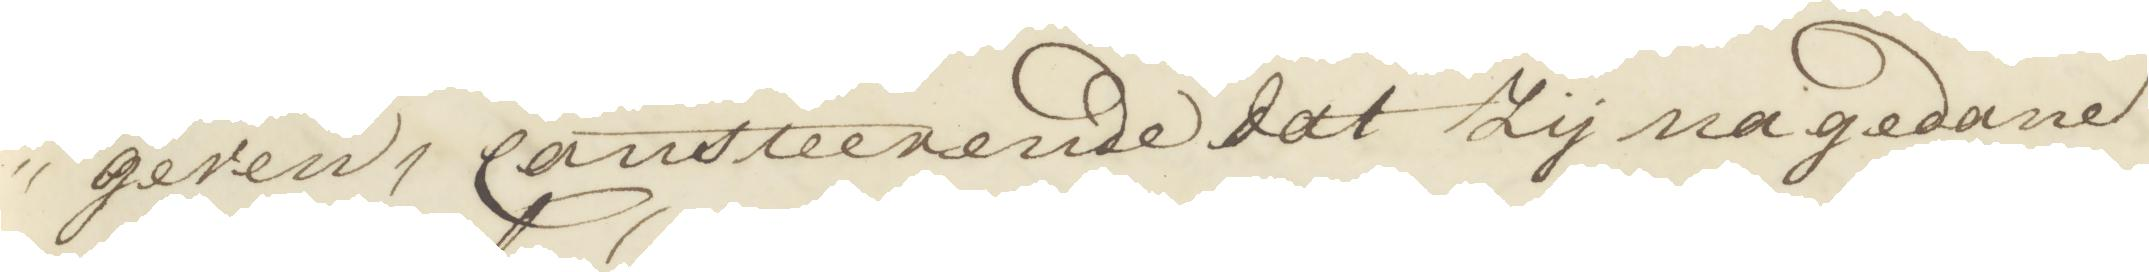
„geven, consteerende dat zij na gedane
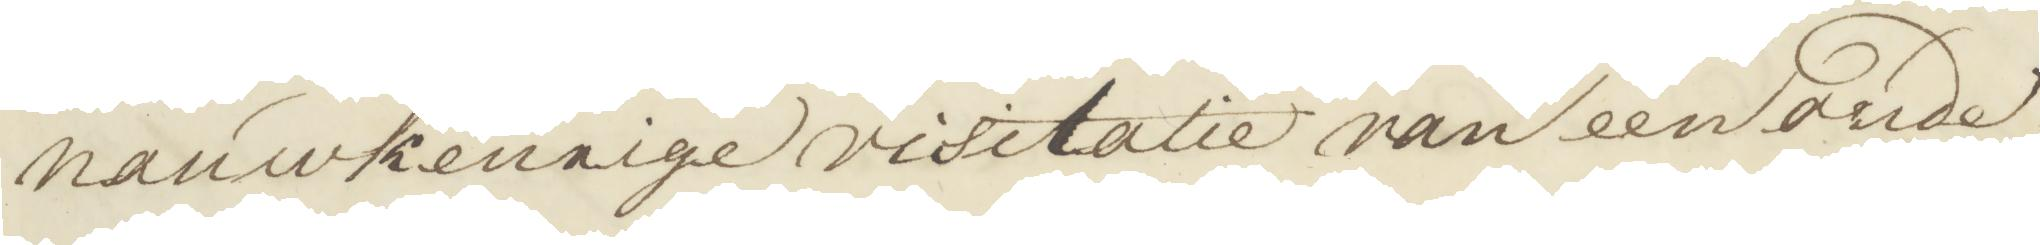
nauwkeurige visitatie van een oude
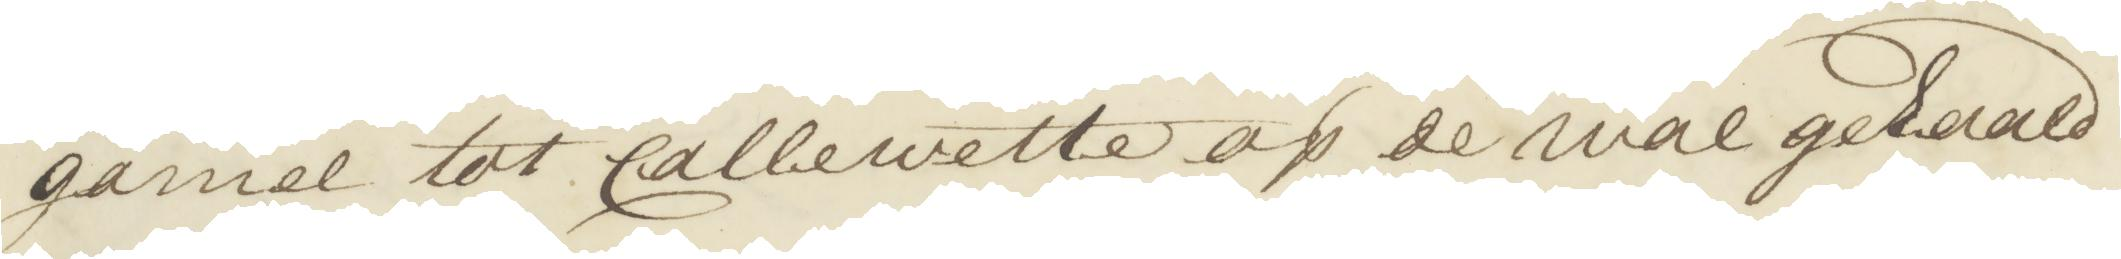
gamel tot Callewette op de wal gehaald
